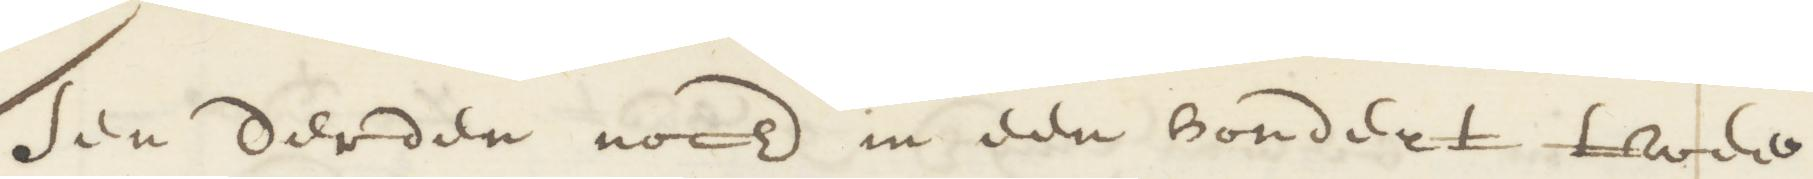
Ten derden noch in een hondert twee
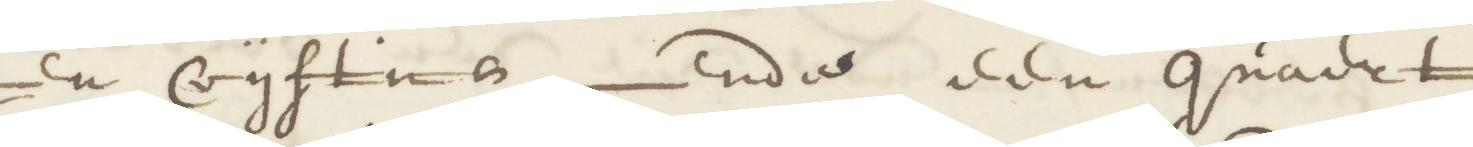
en vijftich ende een quaert
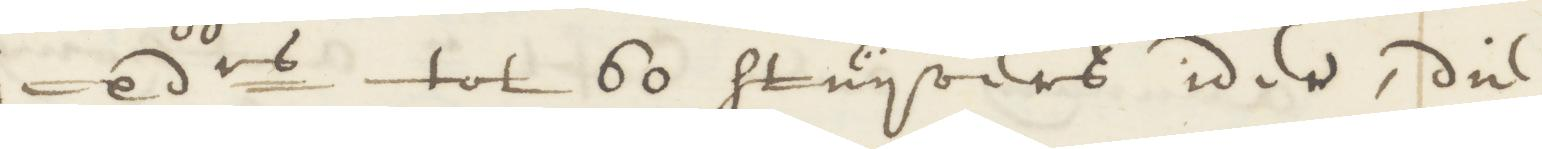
Rijcxd=rs tot 60 stuijvers ider, die
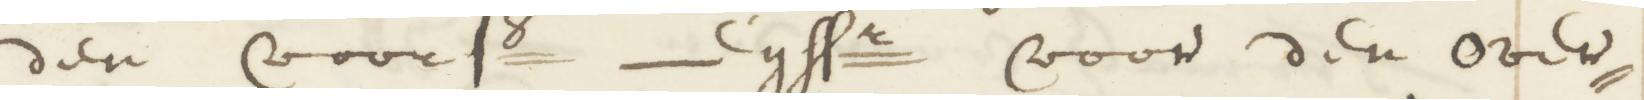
den voors=z eyss=r voor den over„
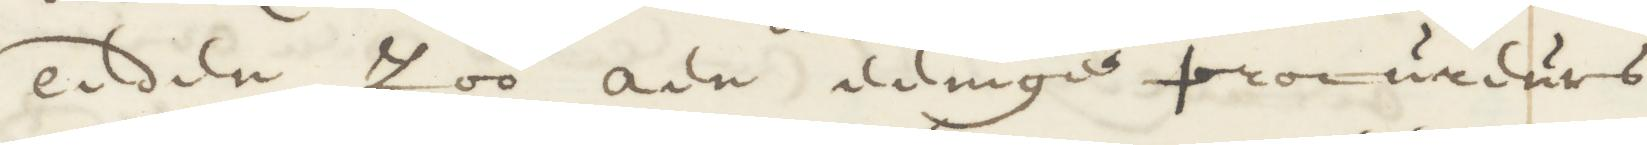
leden zoo aen eenige procureurs
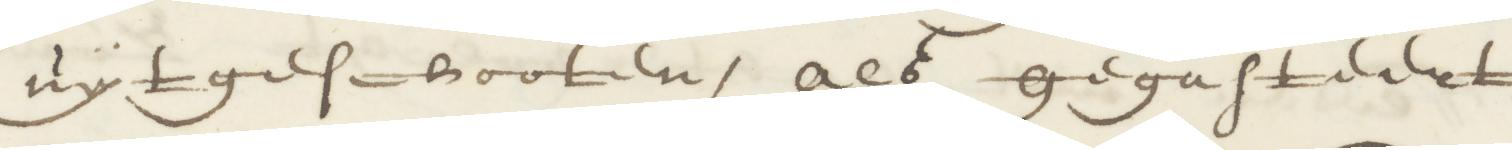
uijtgeschooten, als gegasteert
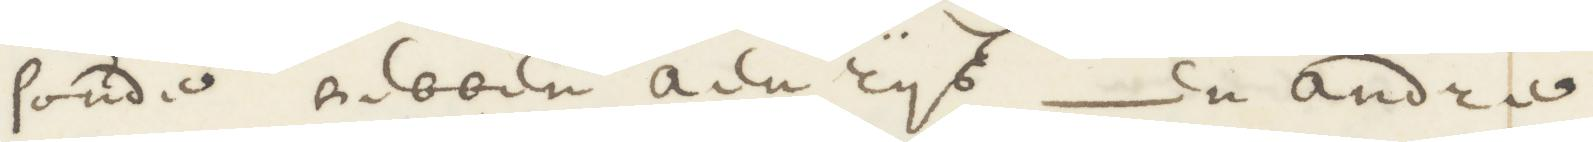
soude hebben aen rijs en andre
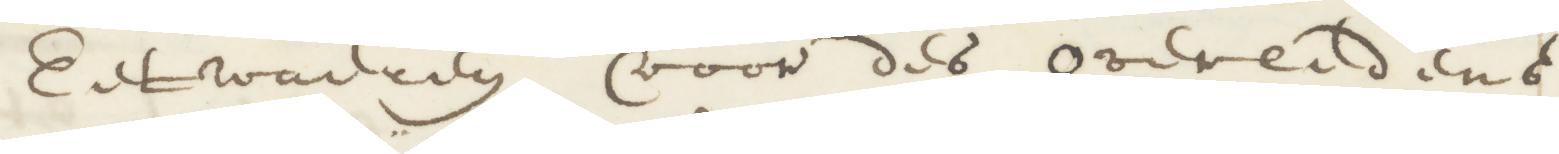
Eetwaeren voor des overledens
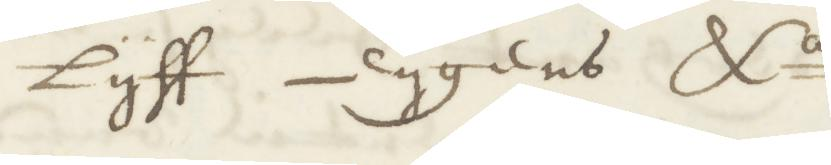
Lijff eijgens Et=a
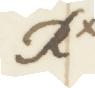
Rx
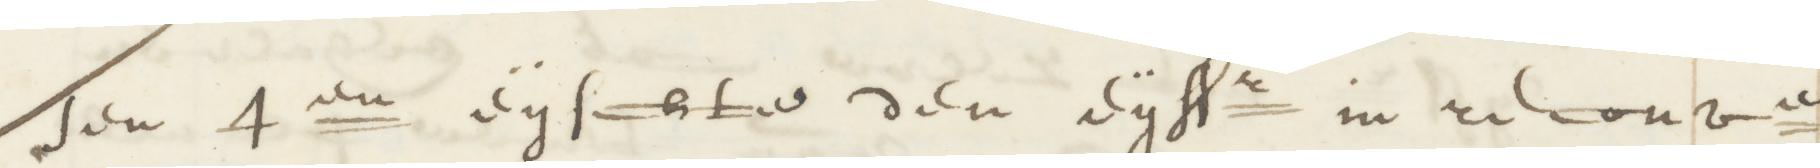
Ten 4=en eijschte den eijss=r in reconv=e
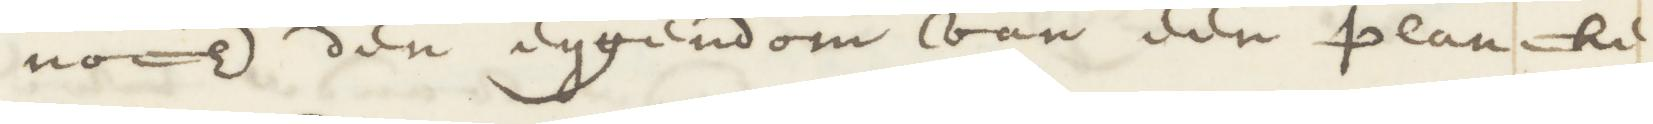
noch den eijgendom van een plancke
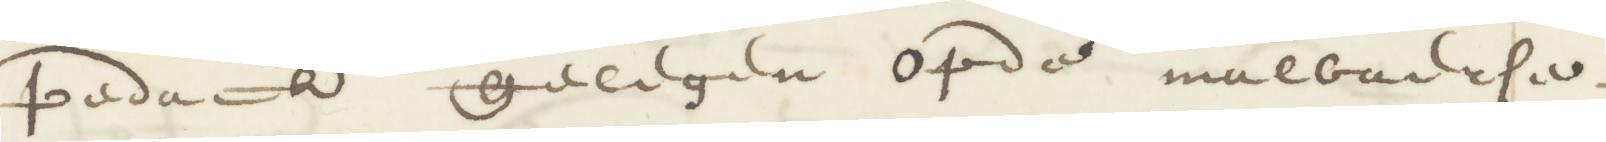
pedack gelegen opde malbaerse
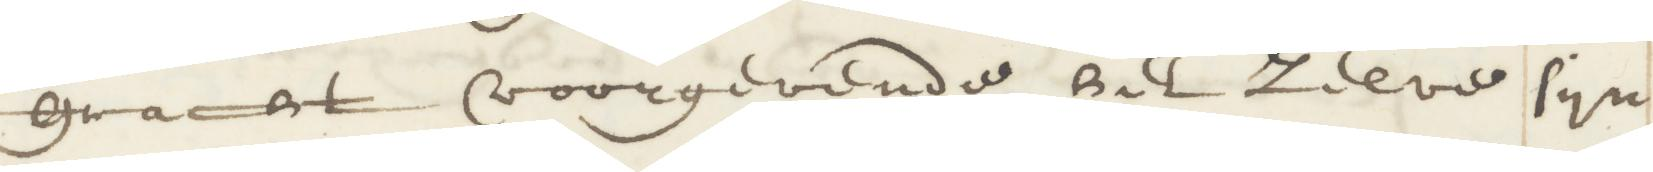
gracht voorgevende het zelve sijn
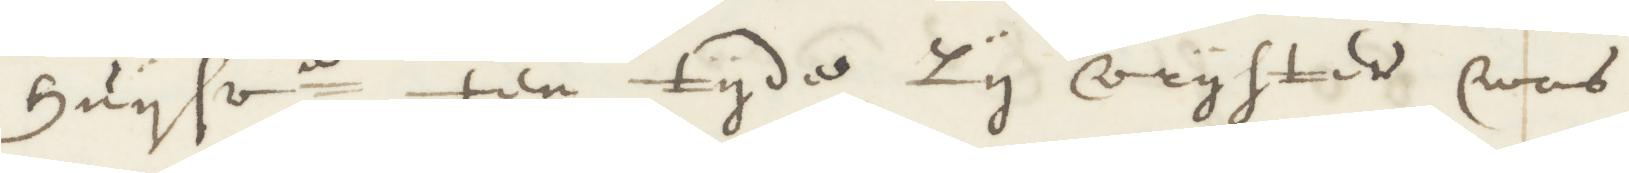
huijsv=w ten tijde zij vrijster was
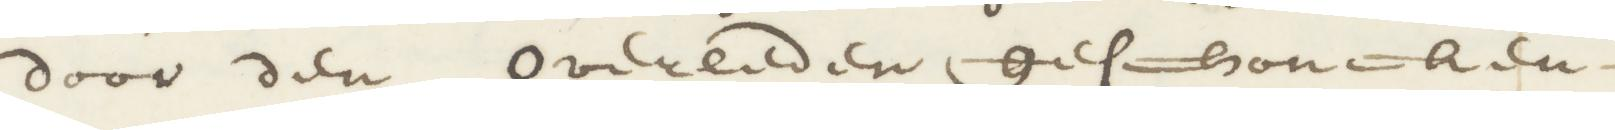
door den overleden geschoncken
